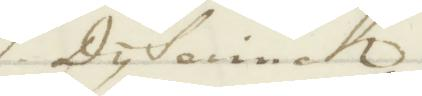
C Dijserinck
